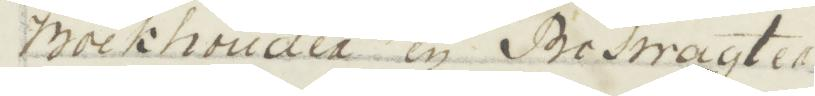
Boekhouder en Boswagter
